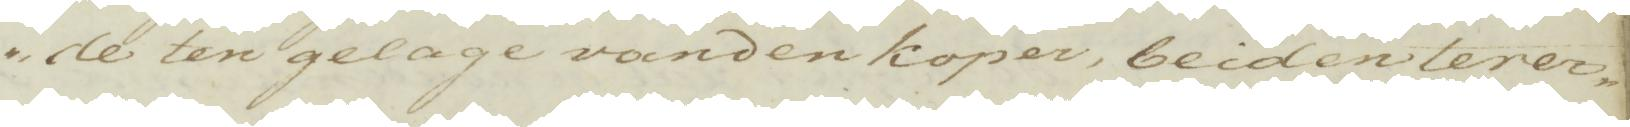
„de ten gelage vanden koper, beiden tever„
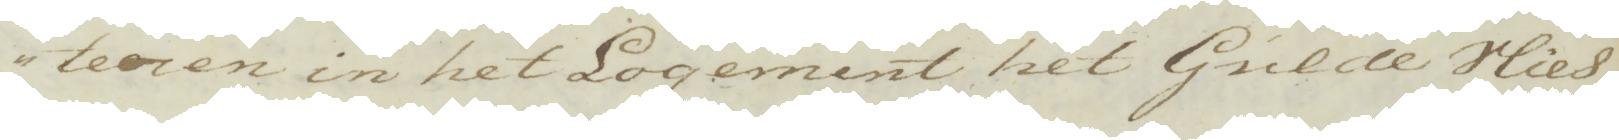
„teren in het Logement het Gulde Vlies
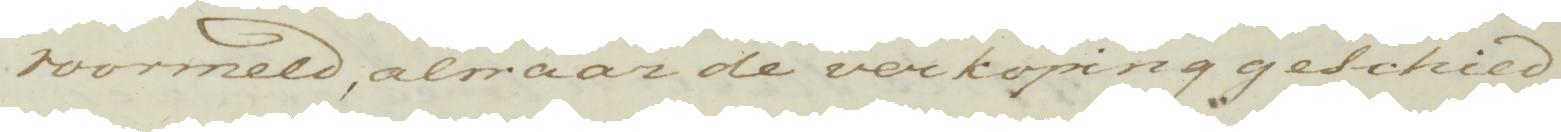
voormeld, alwaar de verkoping geschied
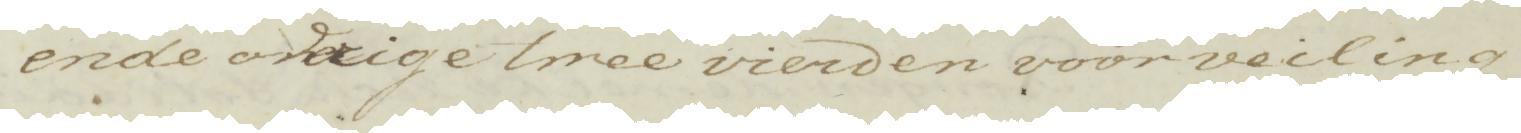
ende overige twee vierden voor veiling
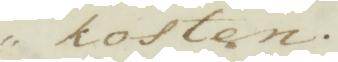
„kosten.
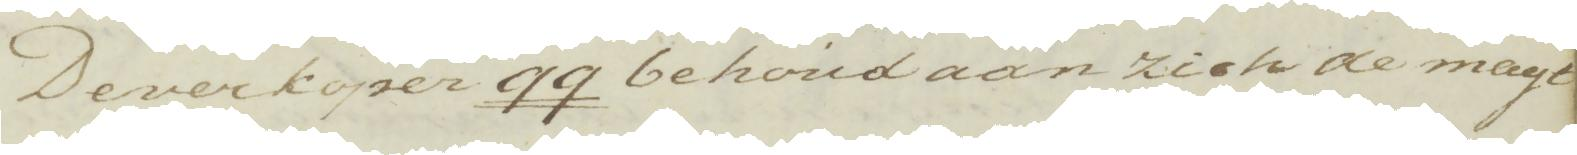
Deverkoper qq behoud aan zich de magt
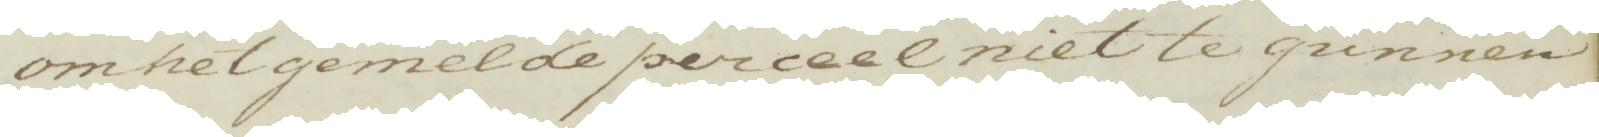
om het gemelde perceel niet te gunnen
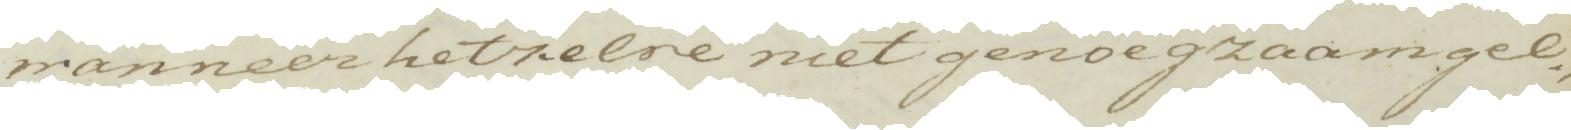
wanneer hetzelve niet genoegzaam gel„
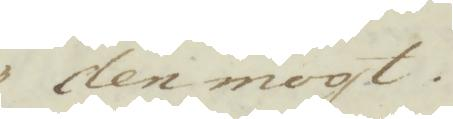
den mogt.
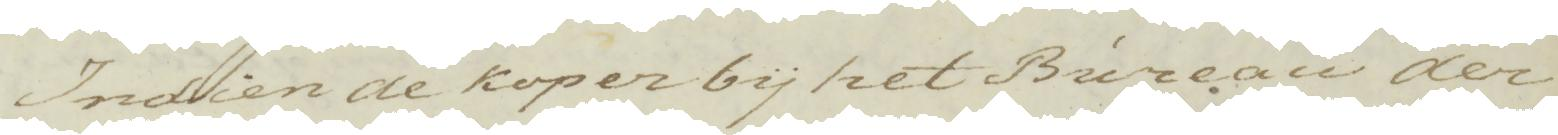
Indien de koper bij het Bureau der
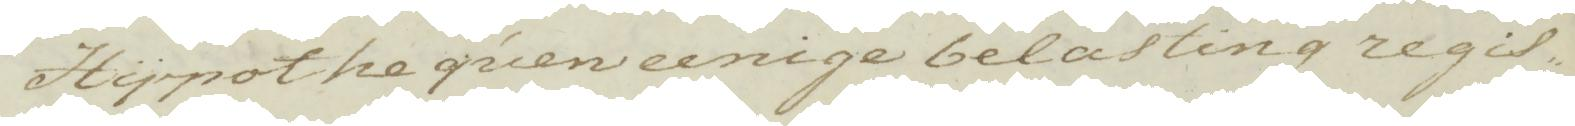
Hijppothequen eenige belasting regis„
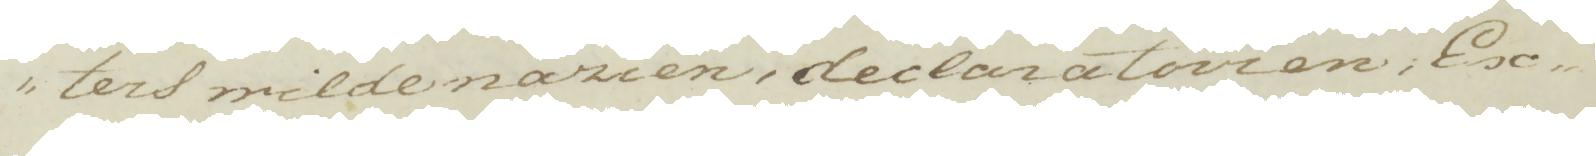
„ters wilde nazien, declaratoiren, Ex„
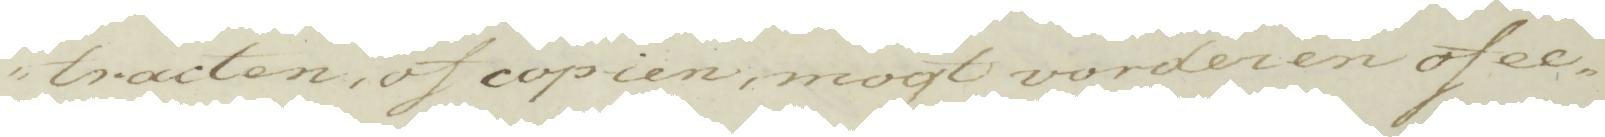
„tracten, of copien, mogt vorderen of ee„
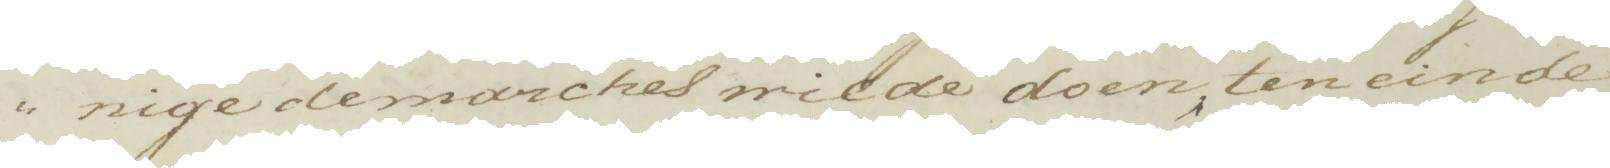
„nige demarches wilde doen, ten einde
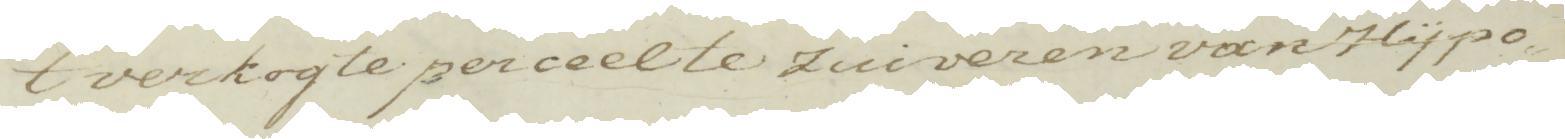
’t verkogte perceel te zuiveren van Hijpo„
